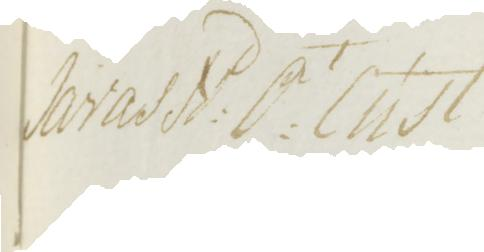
Javas N:d O:t Cust
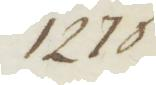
1276
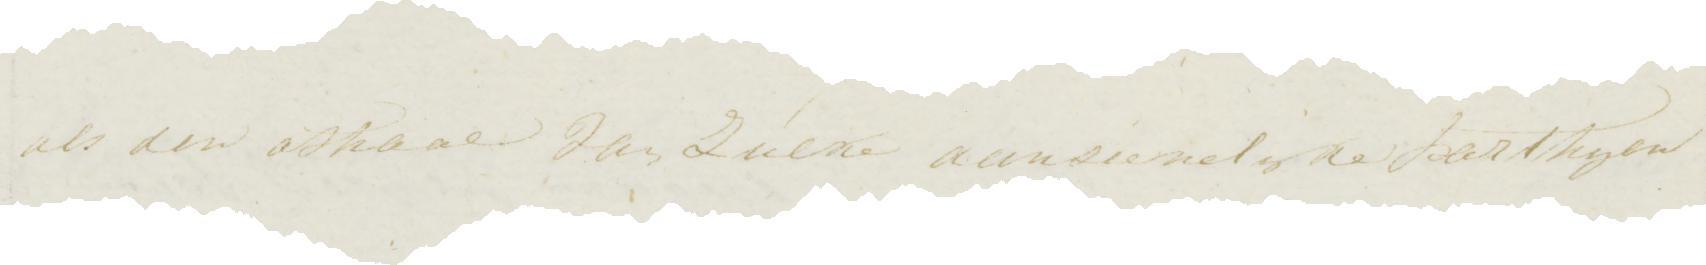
als den afhaal van Zulke aanzienelyke partyen
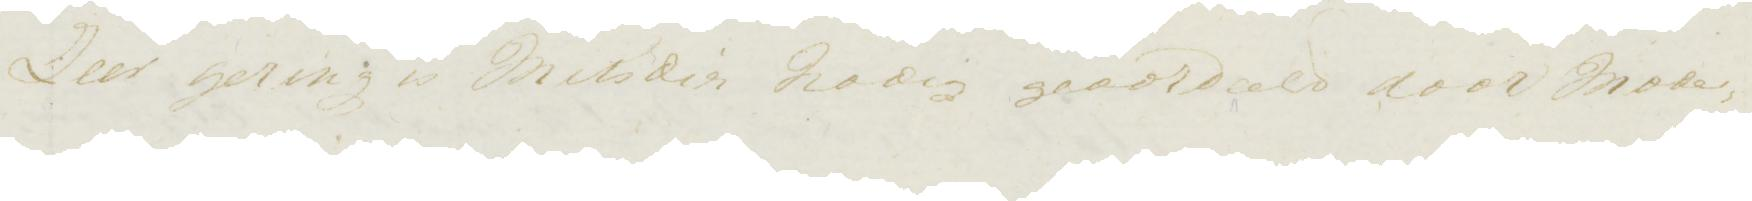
zeer gering is Mitsdien nodig geoordeeld door Mode„
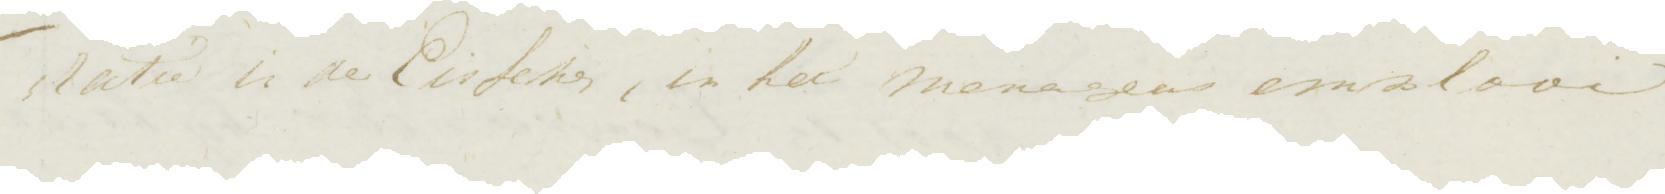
„ratie in de Eischen , in het managees emplooi
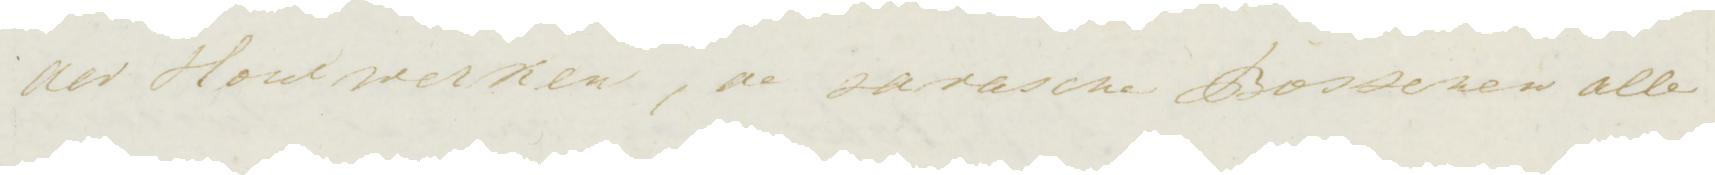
der Houtwerken , de javasche Bosschen alle
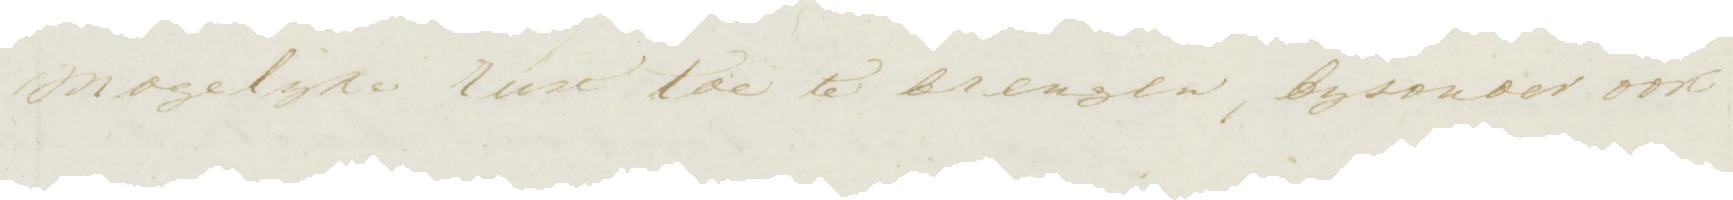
mogelyke rust toe te brengen, bysonder ook
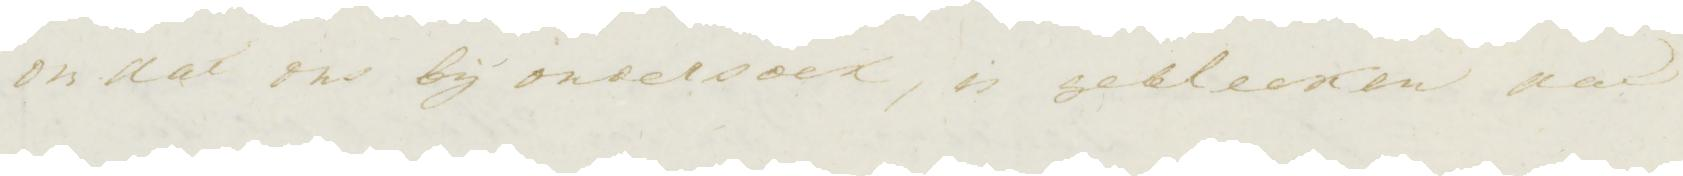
om dat ons bij ondersoek, is gebleeken dat
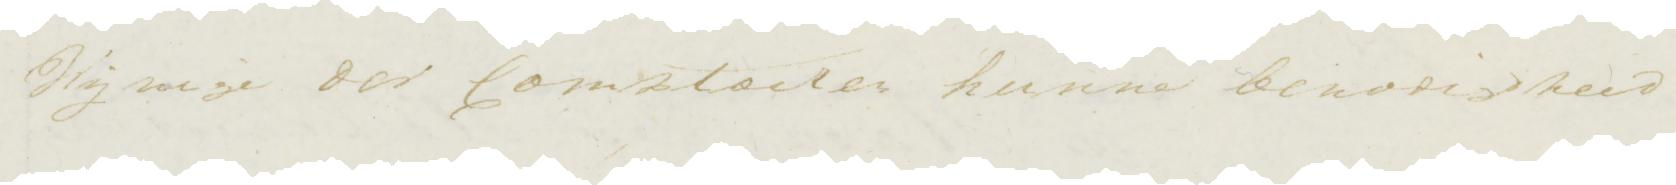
Wijnige der Comptoiren hunne benodigheid
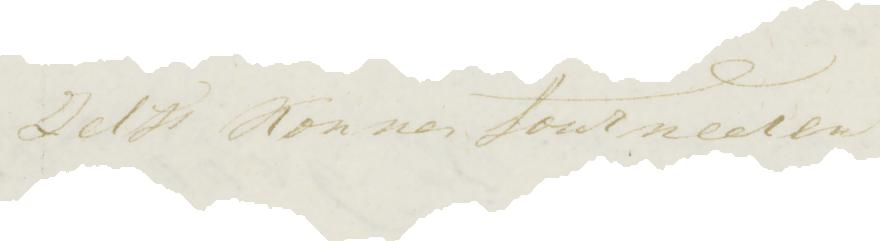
zelfs konnen fourneeren.
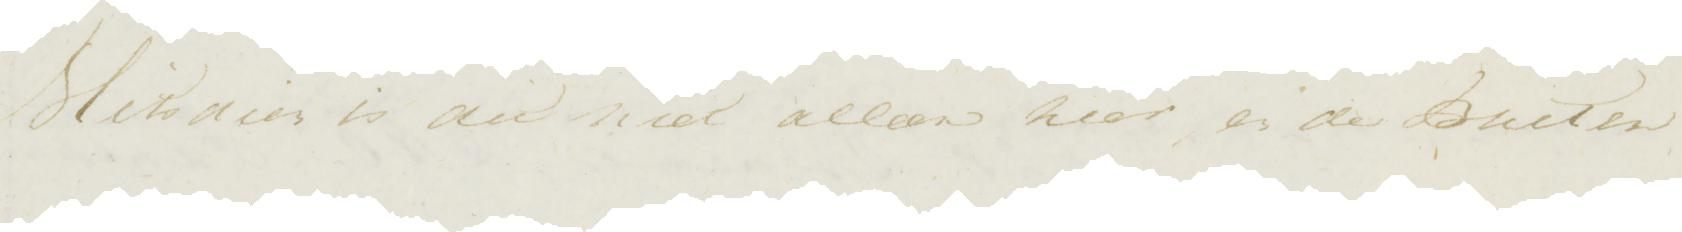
Mitsdien is dit niet alleen hier en de buiten
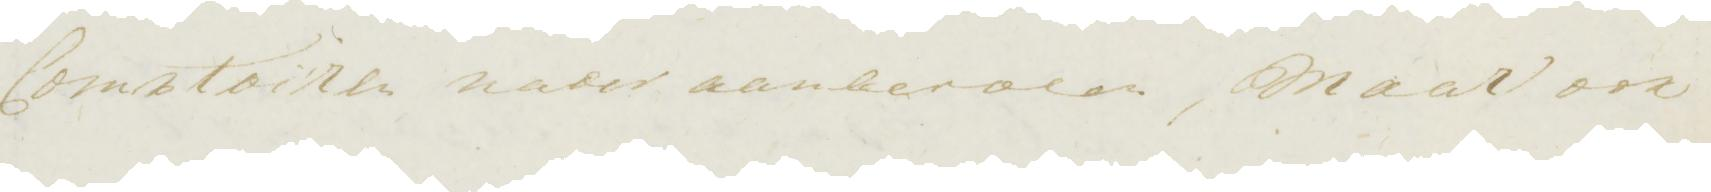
Comptoiren nader aanbevolen , maar ook
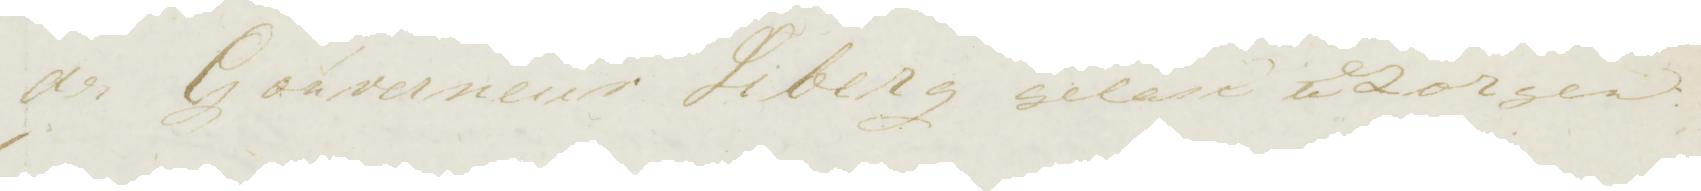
de Gouverneur Liberg gelast te zorgen
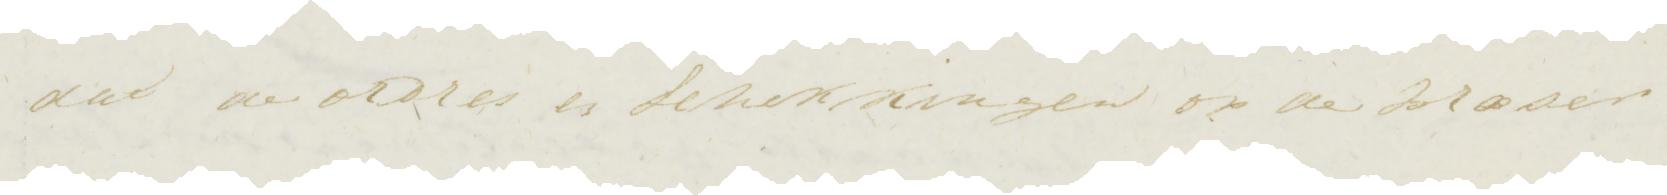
dat de ordres en schikkingen op de præser
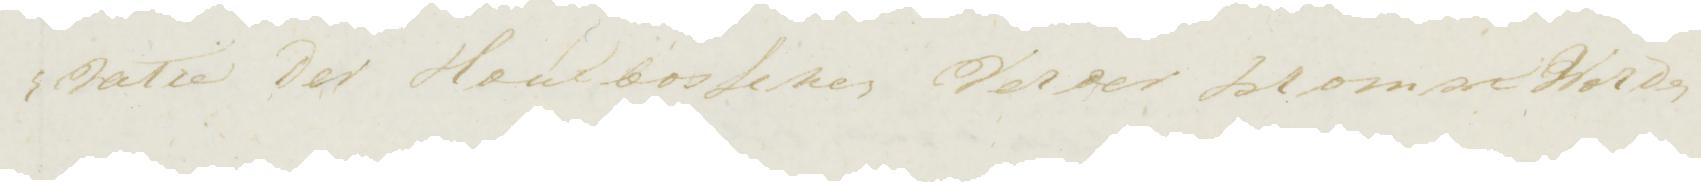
„vatie der Houtbosschen verder prompt Worden
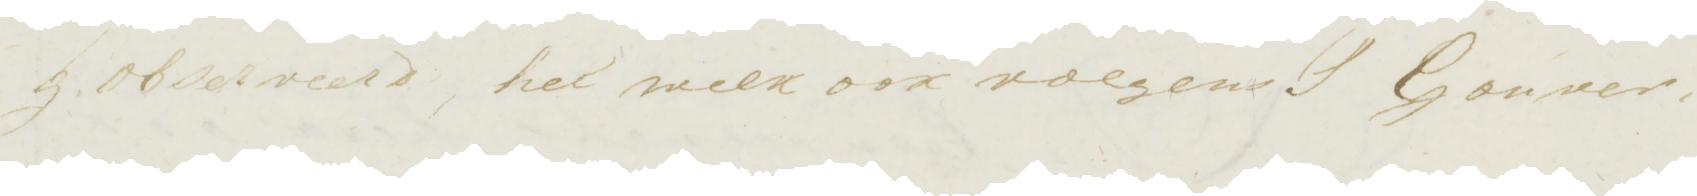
g observeerd , het welk ook volgens 'S Gouver-
